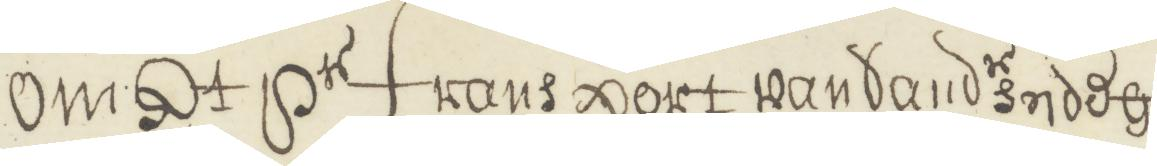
Compt pr Transport van dandrs ende g
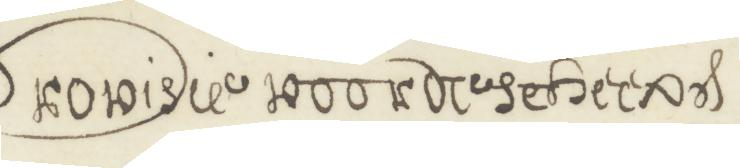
Provisie voor de scheepen
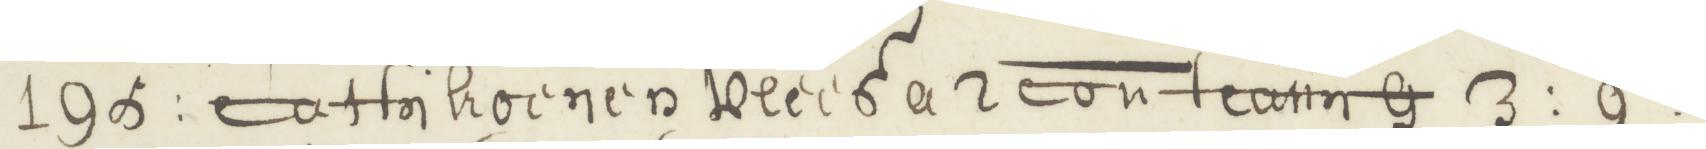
195: cattijhoenen vlees a 2 contratin g 3: 9:
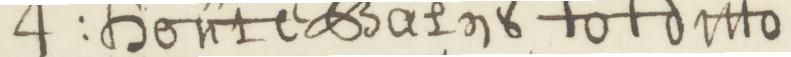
3: houte Balijs tot ditto
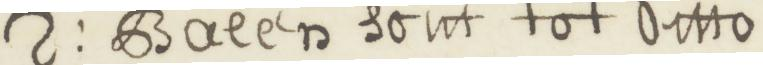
2: Balen sout tot ditto
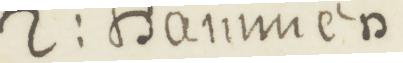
2: kannen
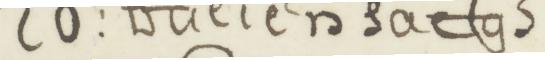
2: balien sacen
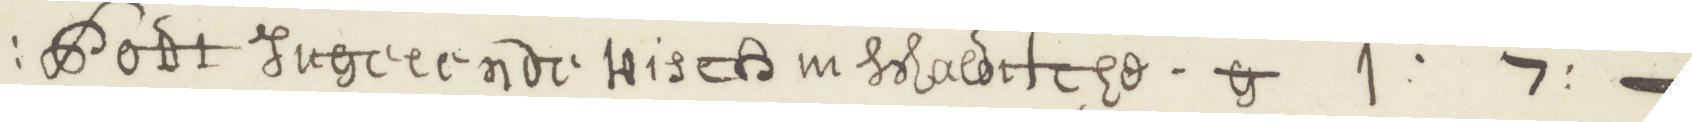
1: Podt Ingelechde visch in schaldsche - g 1. 7: —
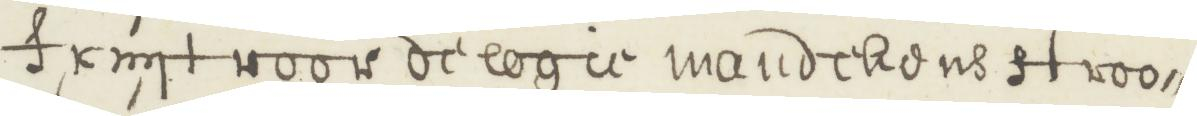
: fruijt voor de logie mandekens stroo„
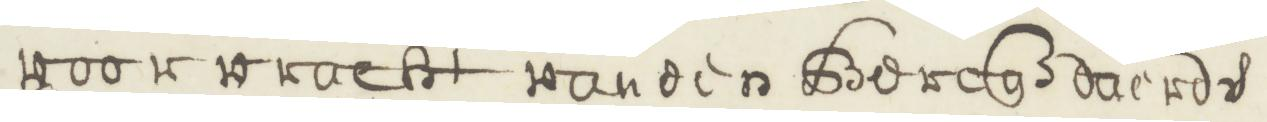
voor vracht van den Berchen daerde
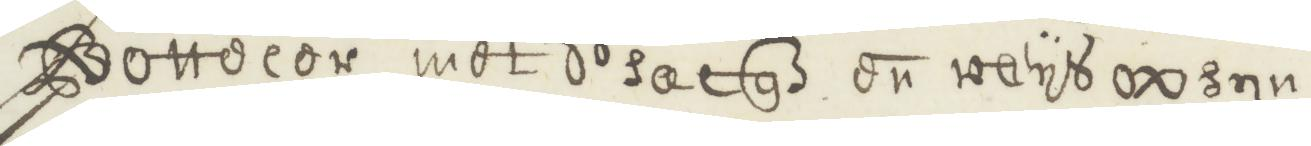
Bottecor met do sacen en vleijs op syn
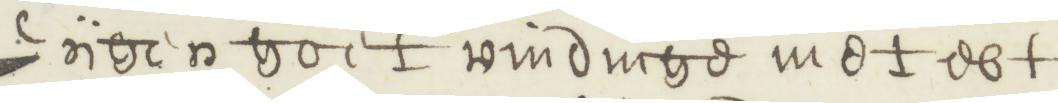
Gijer goet vindinge met ebt
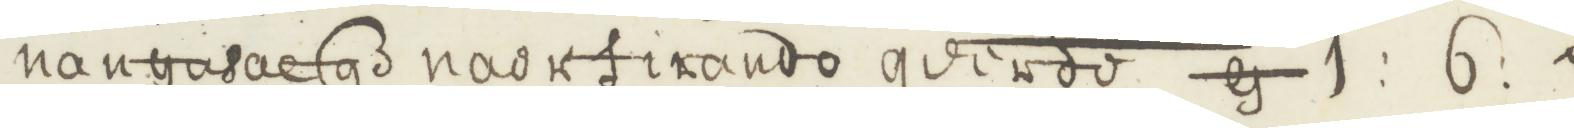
nangasaeen naer firando geerde g 1: 6:
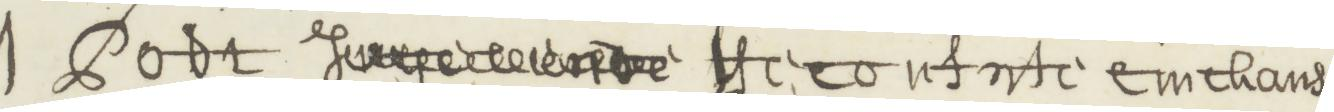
1 Post Ingelechde Geconfyte cinchanen
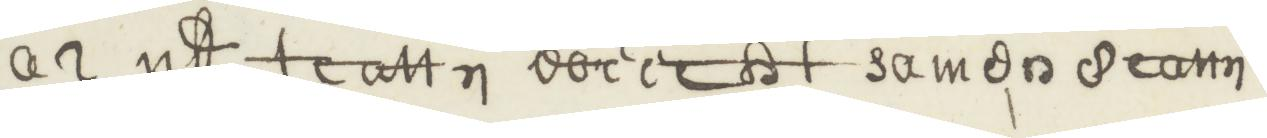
22 nd tcattij weecht samen 8 cattn
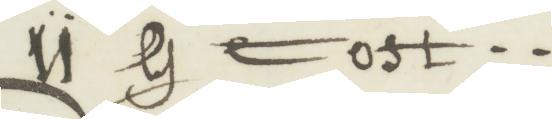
11 g cost-
